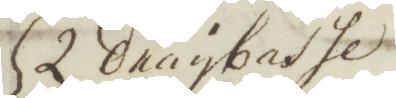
2 draijbasse
